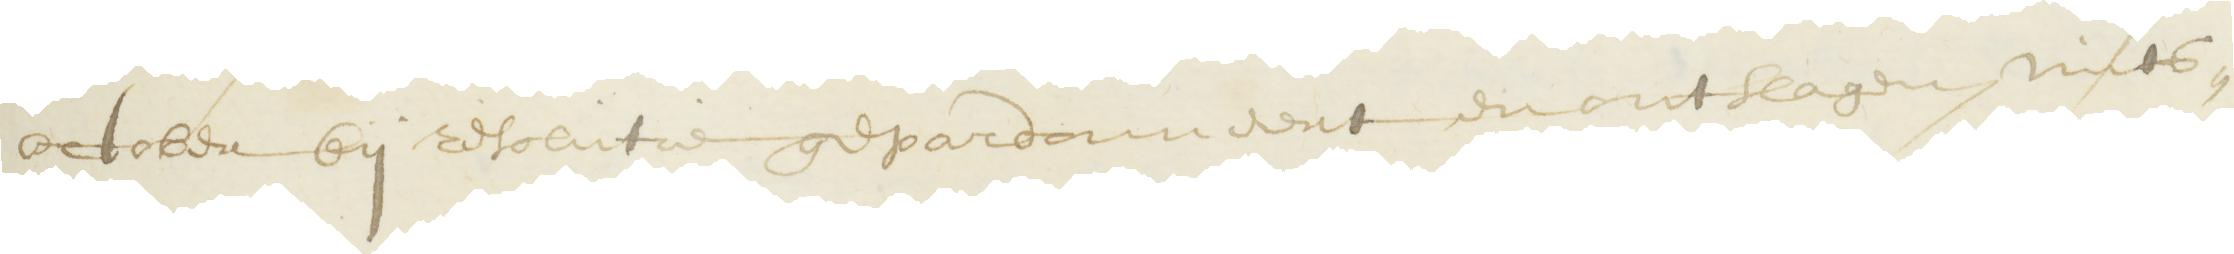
october bij resolutie gepardonneert en ontslagen, mits„
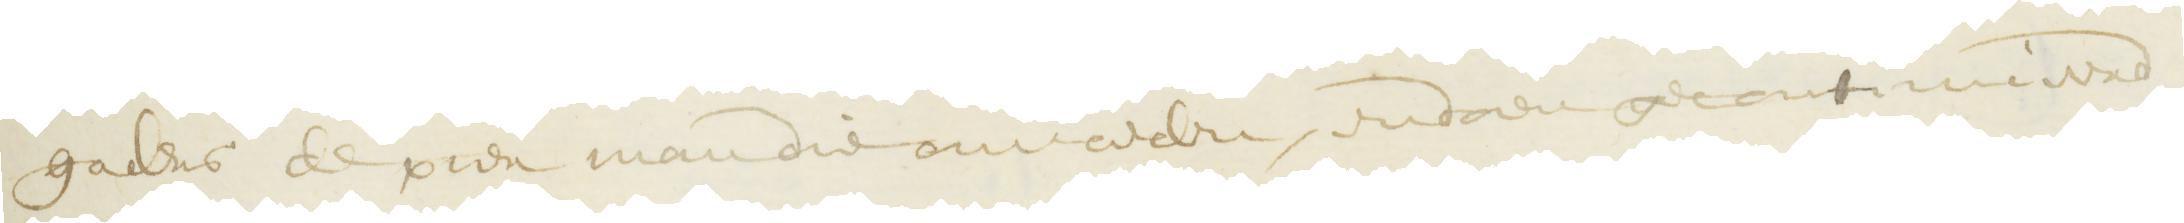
gaders de vier man die omreden, endoen gecontinueerd
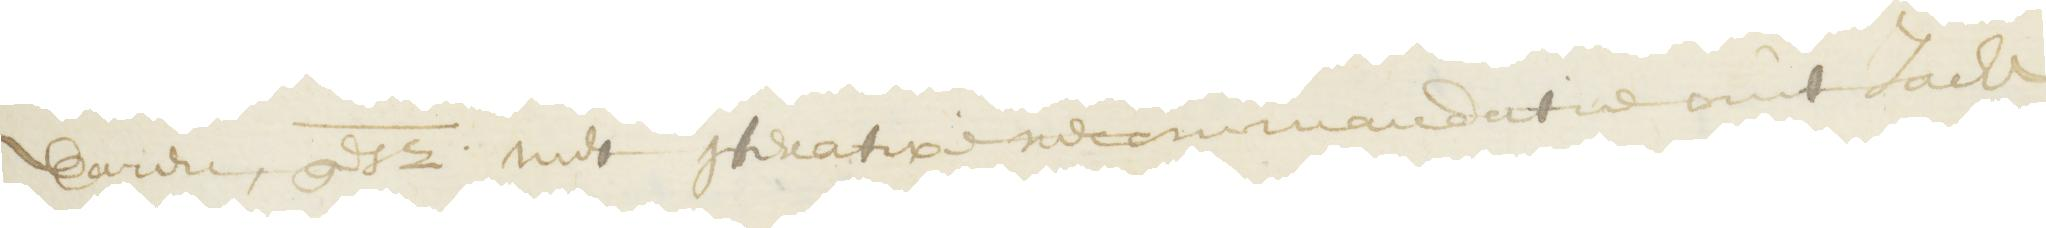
waren, gesz: met jterative recommandatie om ’t Iacht
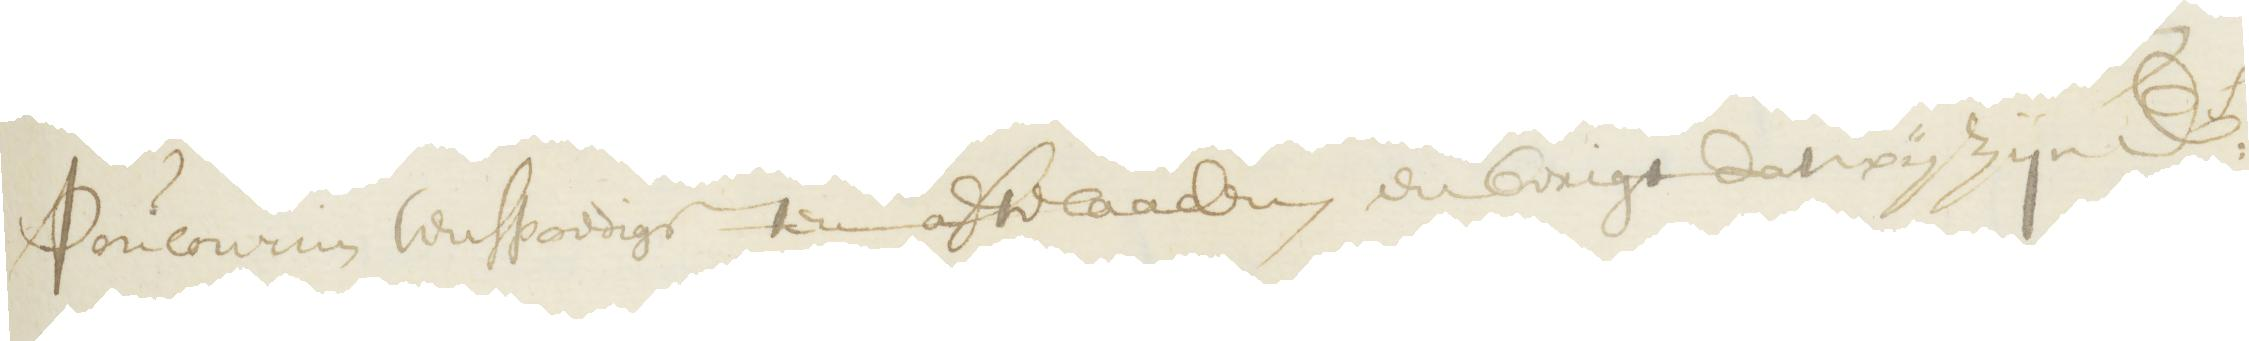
Poulourun tenspoedigsten aftelaaden, en berigt dat wij zijn E:s
